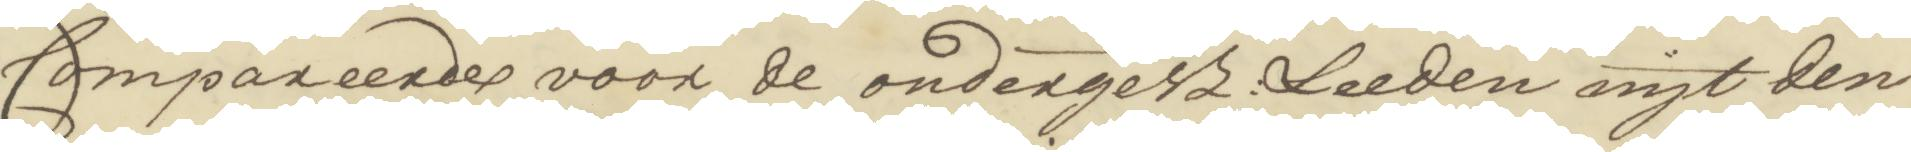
Compareerde voor de ondergesz: Leeden uijt den
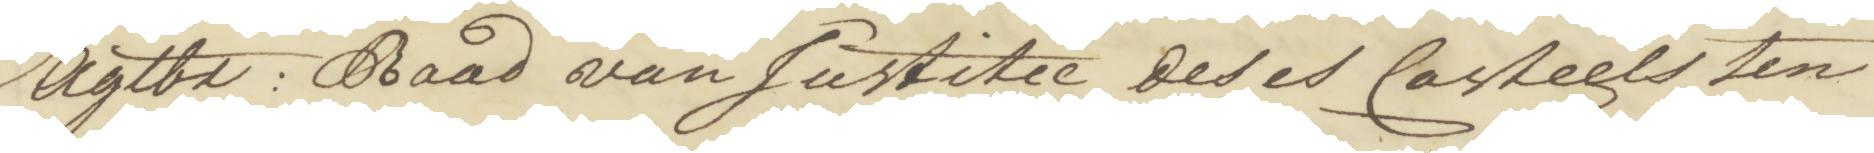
Agtbr: Raad van Justitie deses Casteels ten
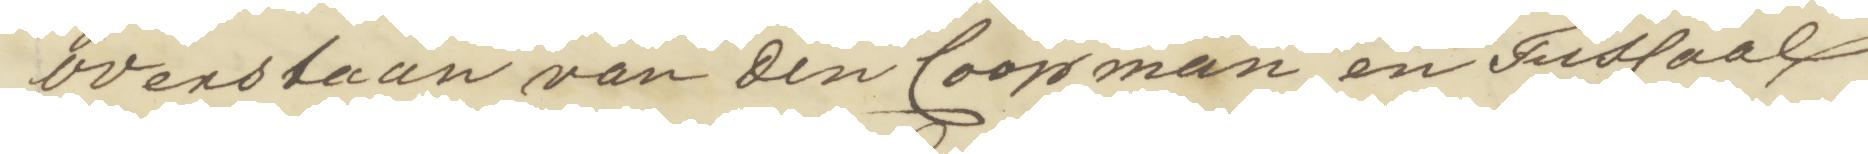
overstaan van den Coopman en fiscaal
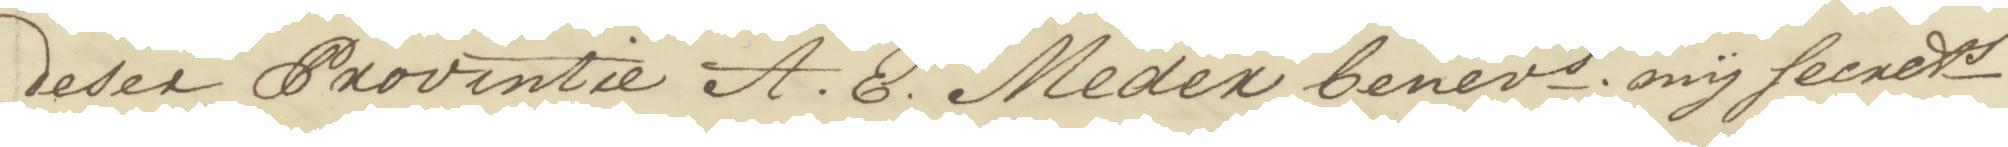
deser Provintie A. E. Meder benev–s. mij secret–s
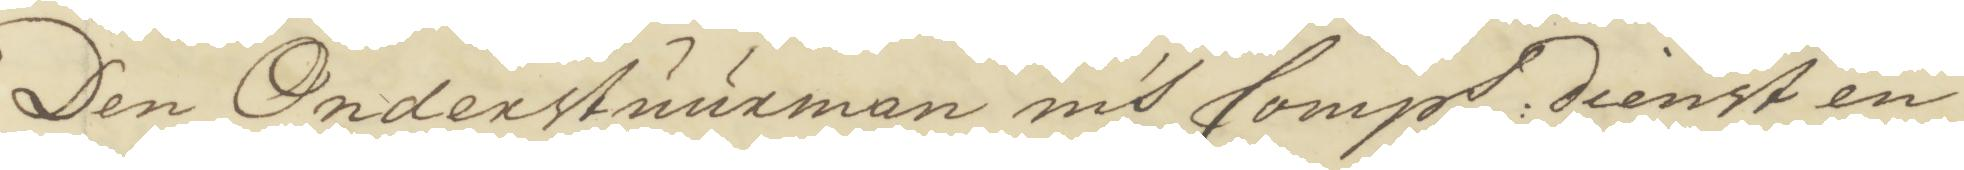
Den Onderstuurman in's Comp–s: dienst en
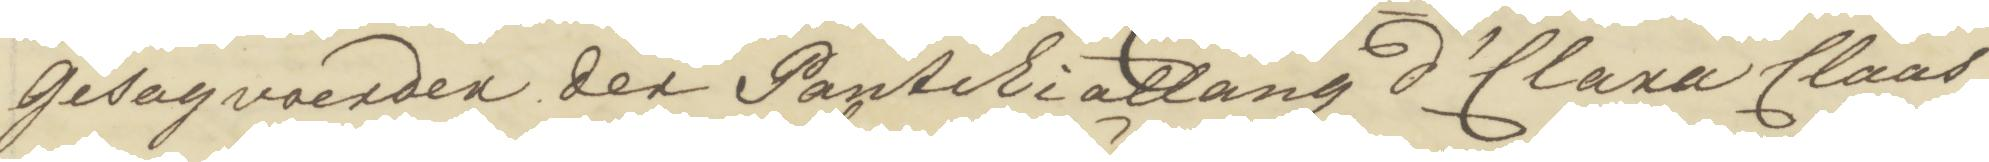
gesagvoerder der Pantchiallang d’Clara Claas
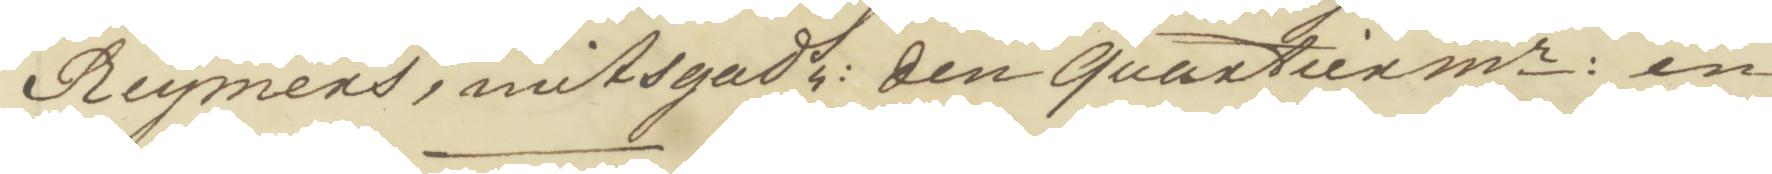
Reijmers, mitsgad„s: den quartierm–r: en
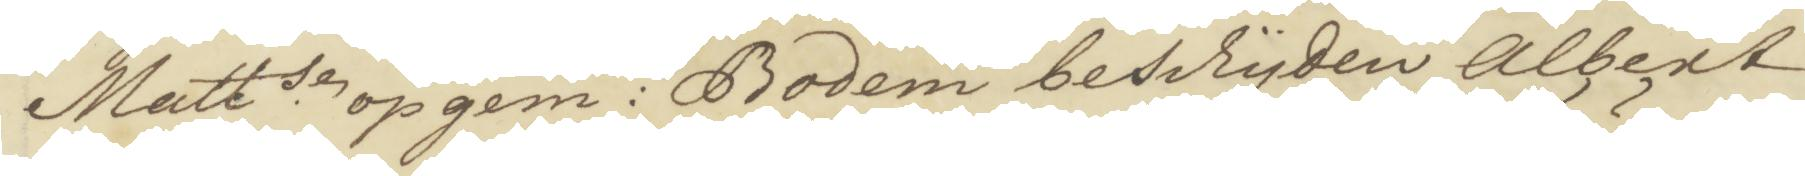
Matr.sen op gem: Bodem beschijden Albert
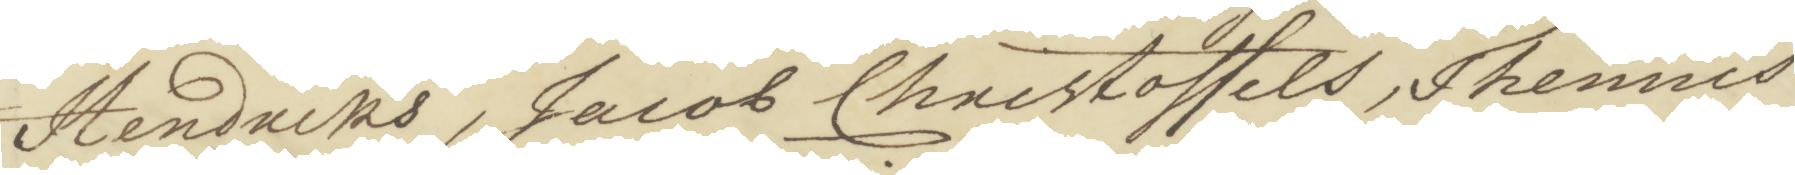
Hendriks, Jacob Christoffels, Theunis
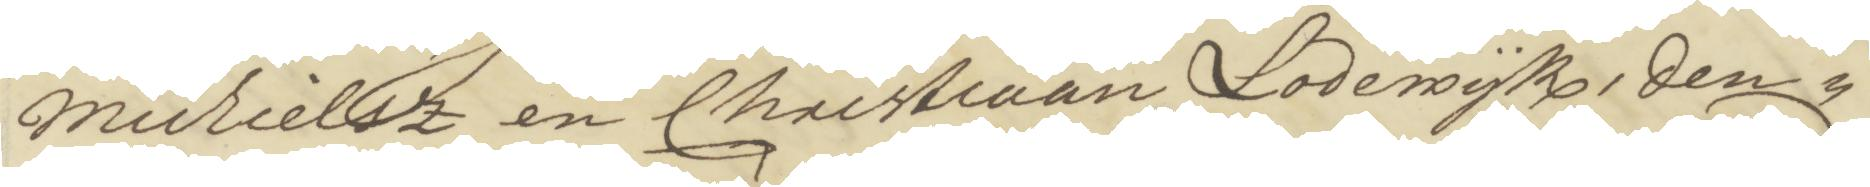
michielsz en Christiaan Lodewijk, den„
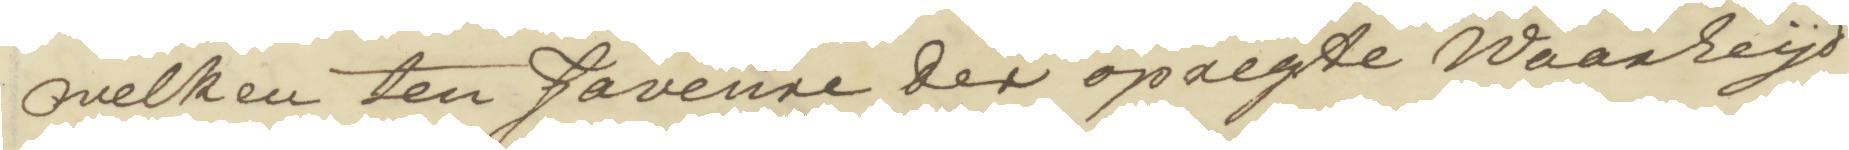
welken ten faveure der opregte waarheijd
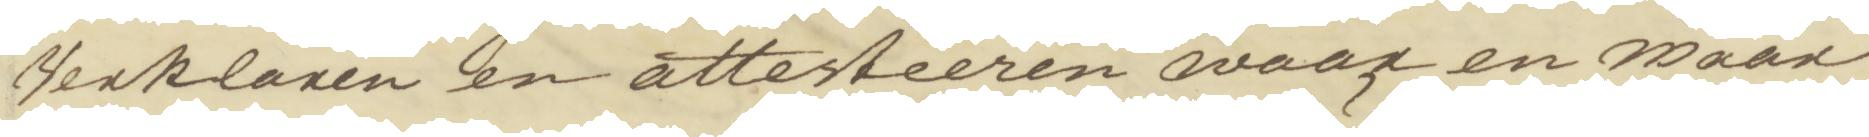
verklaren en attesteeren waar en waar
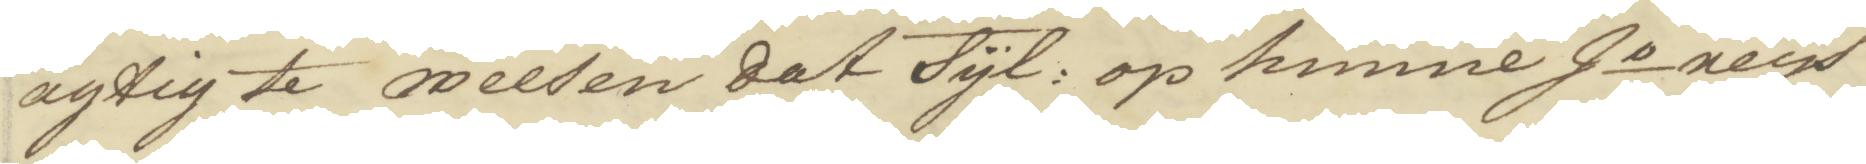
agtig te weesen dat sijl: op hunne j–o reijs
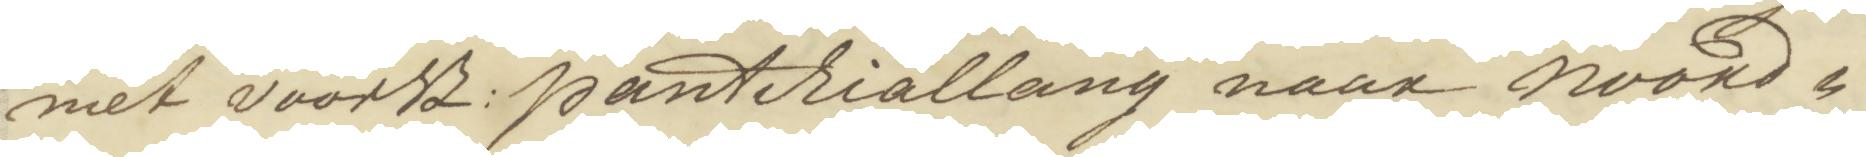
met voorsz: pantchiallang naar noord„
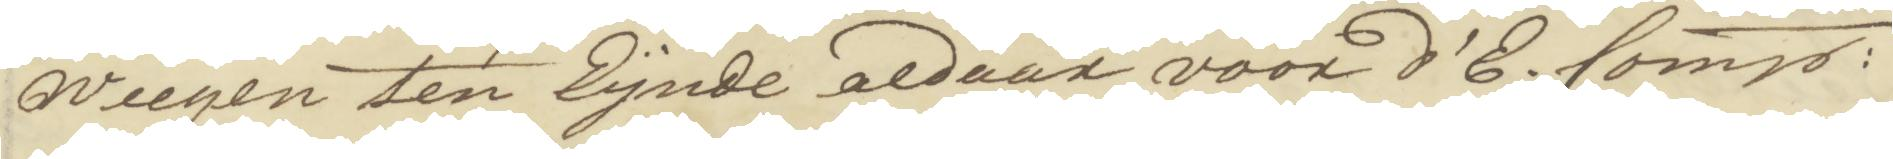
weegen ten Eijnde aldaar voor d’E. Comp:
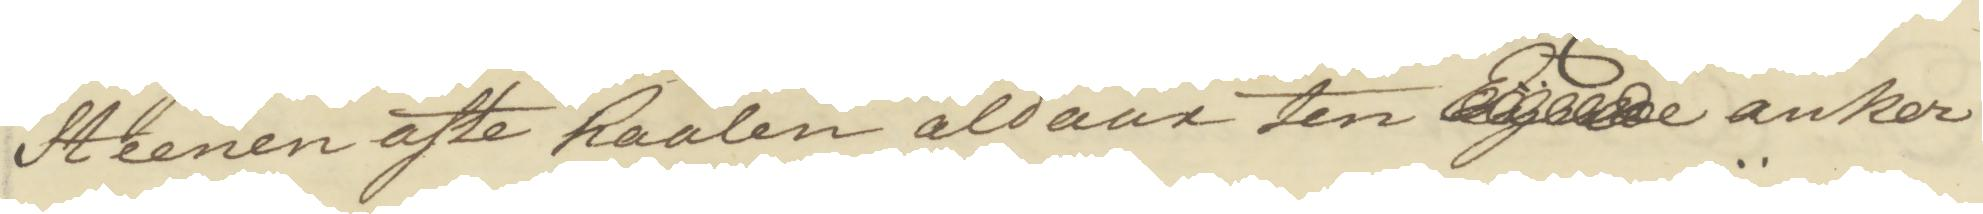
steenen afte haalen aldaar ten Eijnde anker
